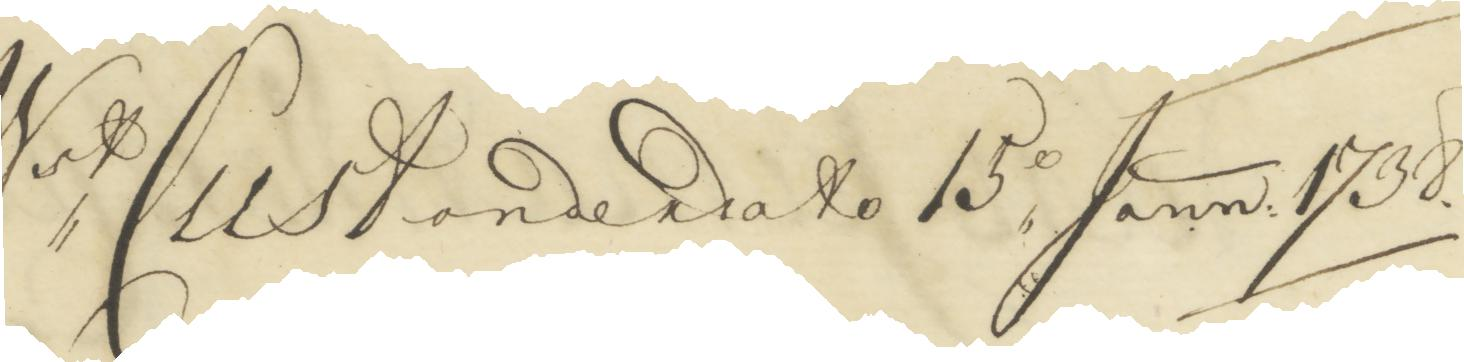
Van Sumat„s W„st Cust onderdato 15„e Jann: 1738.
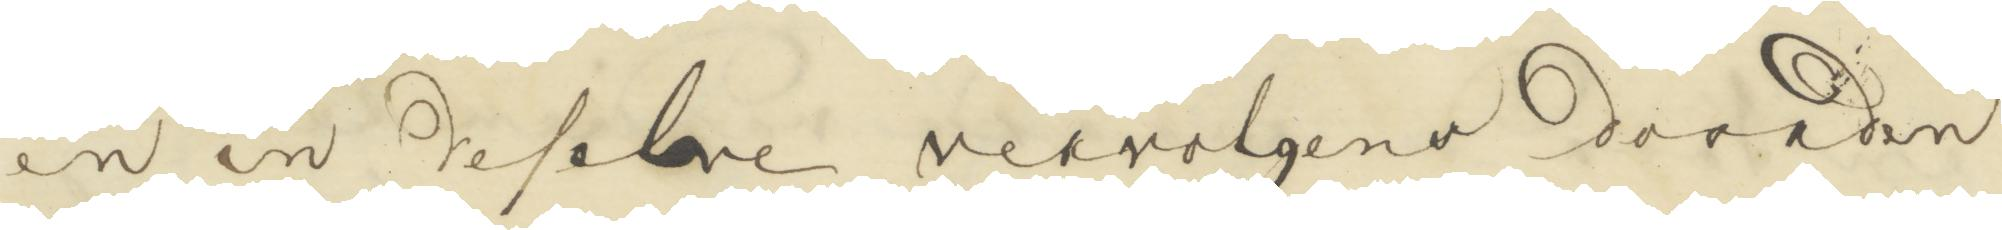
en in deselve vervolgens door den
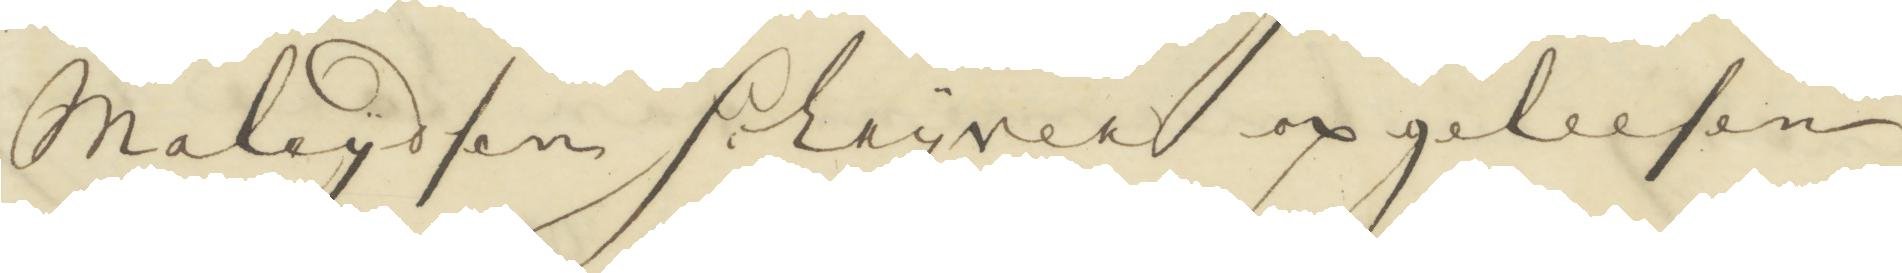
Maleijdsen schrijver op geleesen
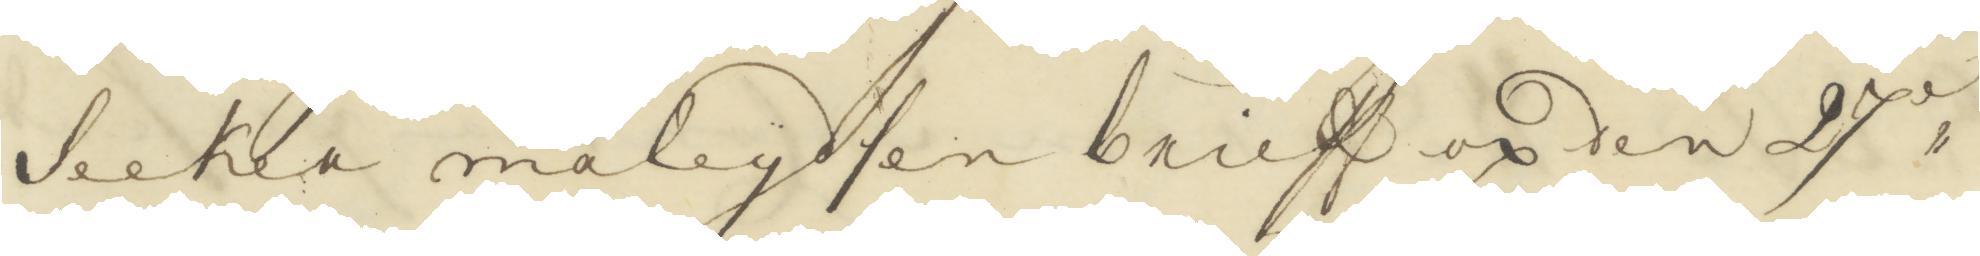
seeker maleijdsen brieff op den 27„e
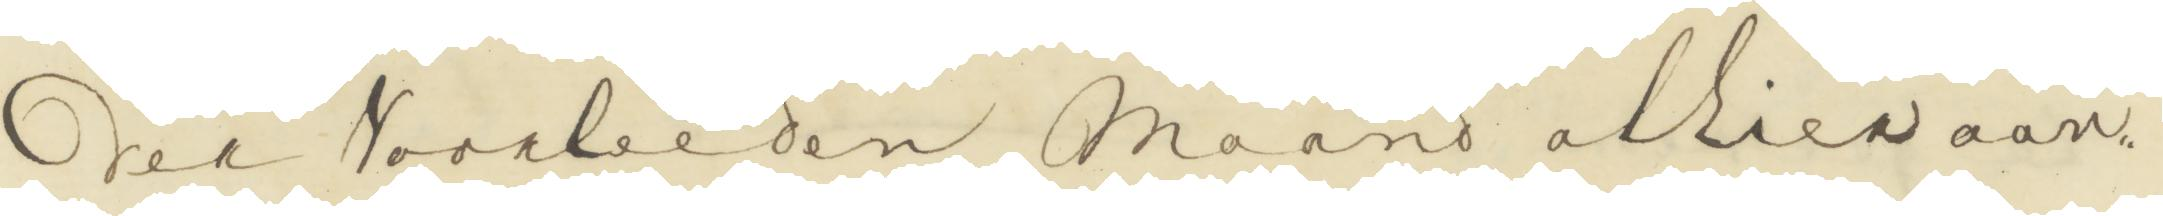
der voorleeden maand alhier aan„
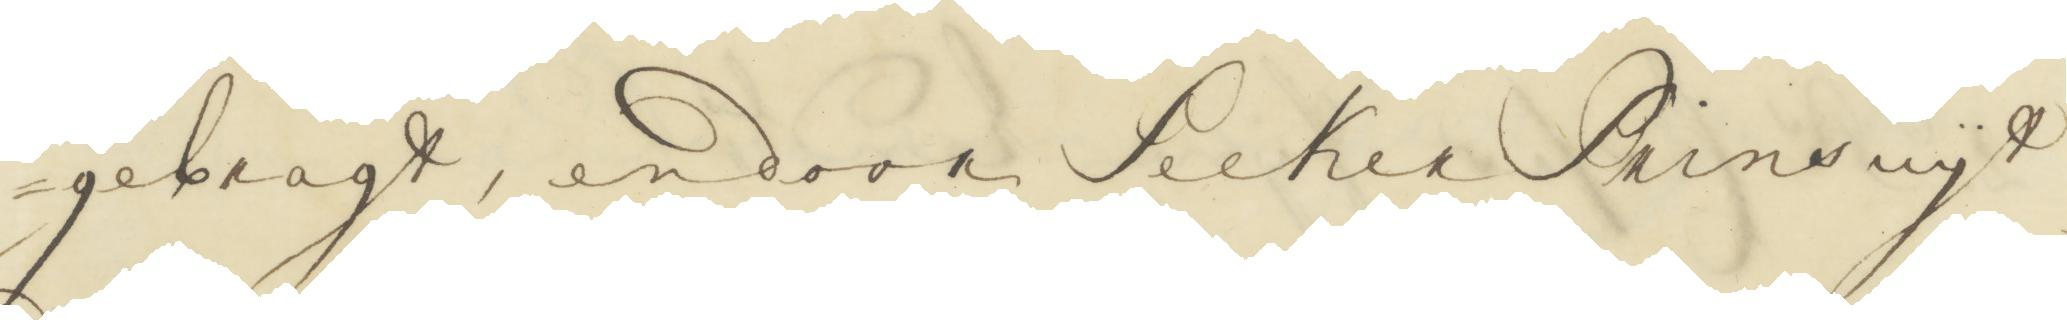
=gebragt, en door seeker Prins uijt
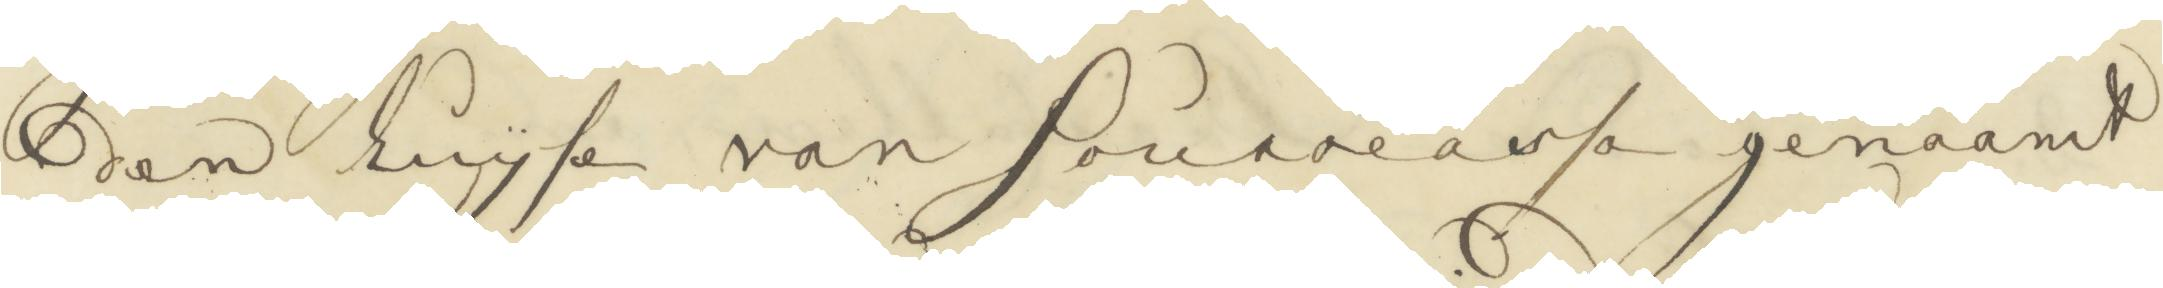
den huijse van Souroeassa genaamt
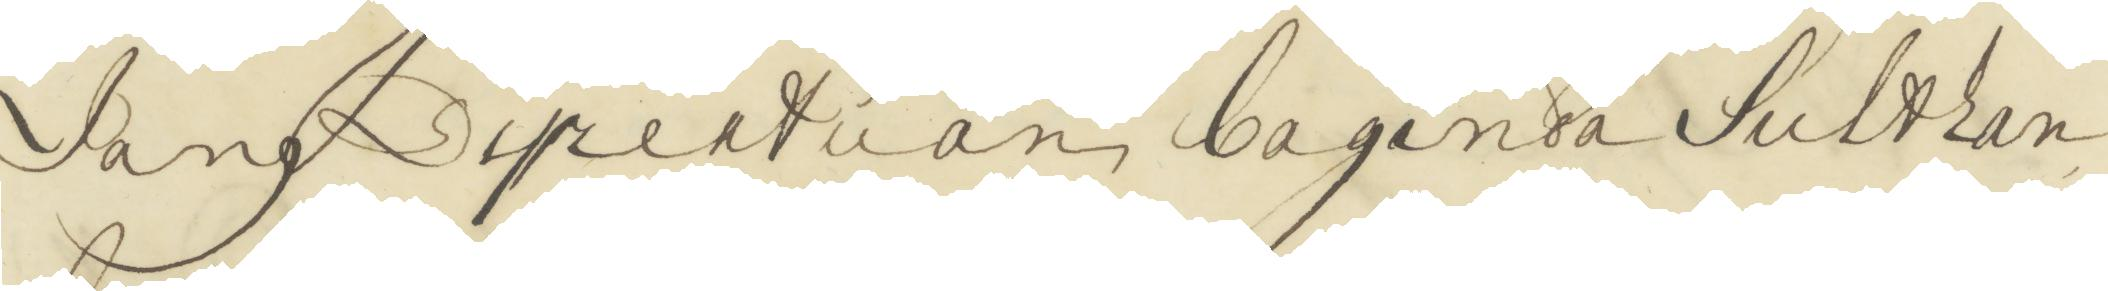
Jang Dipertuan baginda sulthan
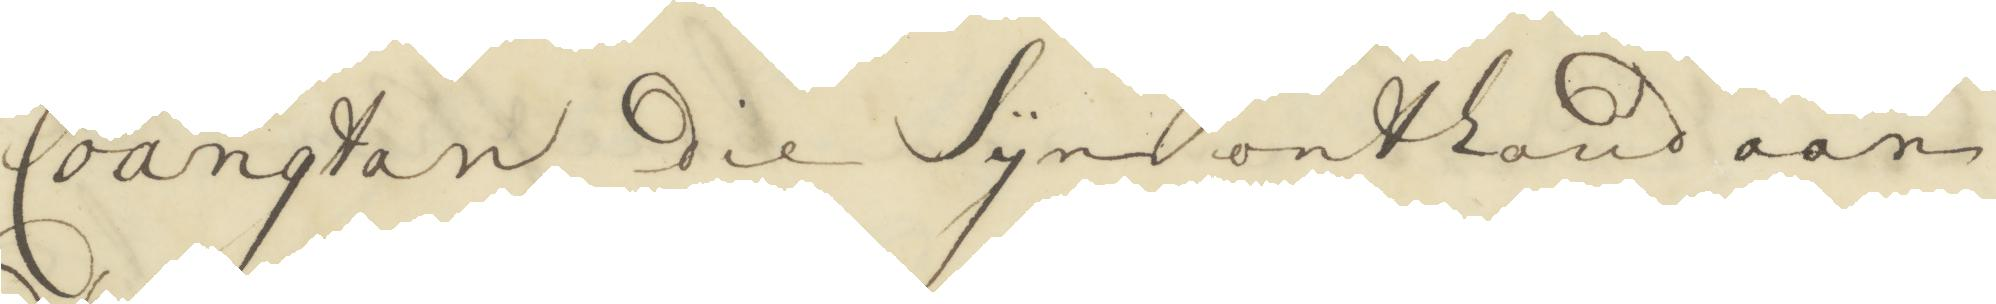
Coangtan die sijn onthoud aan
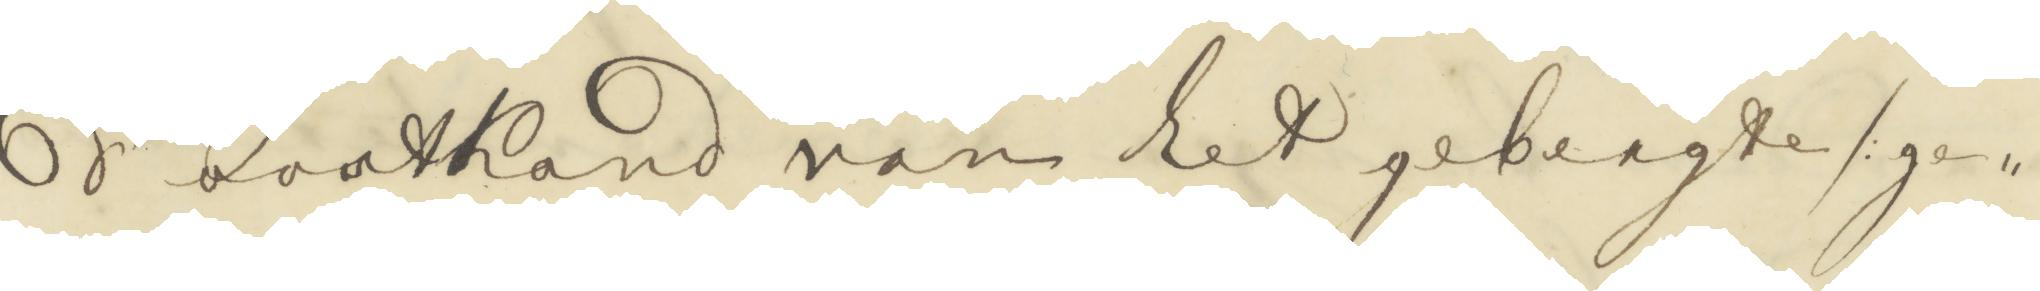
d'oostkand van het gebergte /:ge„
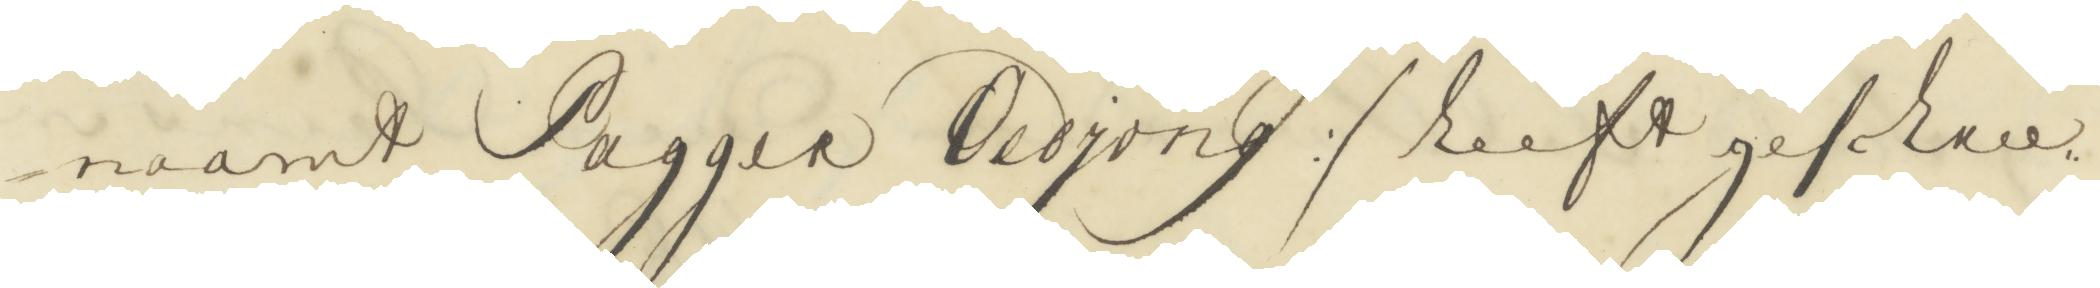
=naamt Pagger Oedjong :/ heeft geschree„
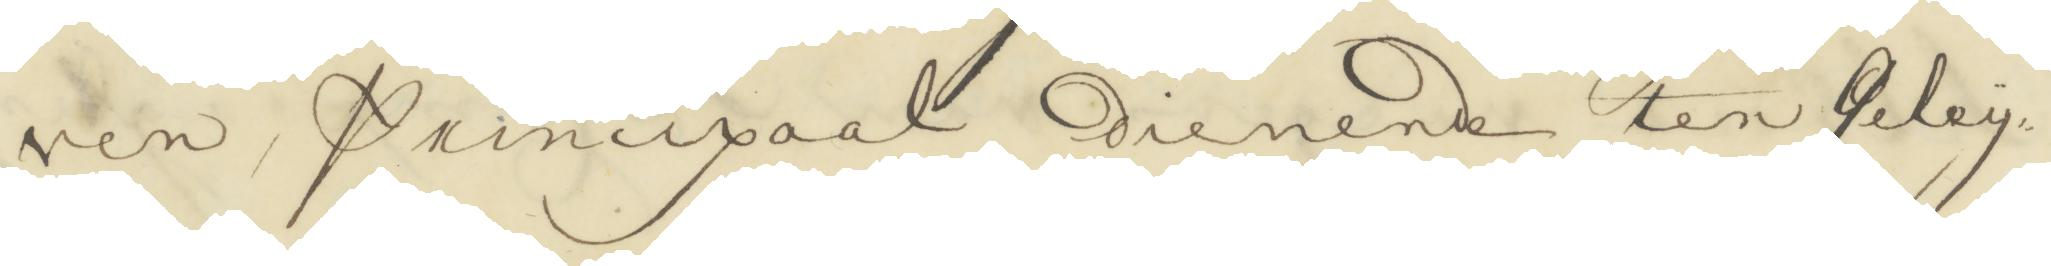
=ven, principaal dienende ten geleij=
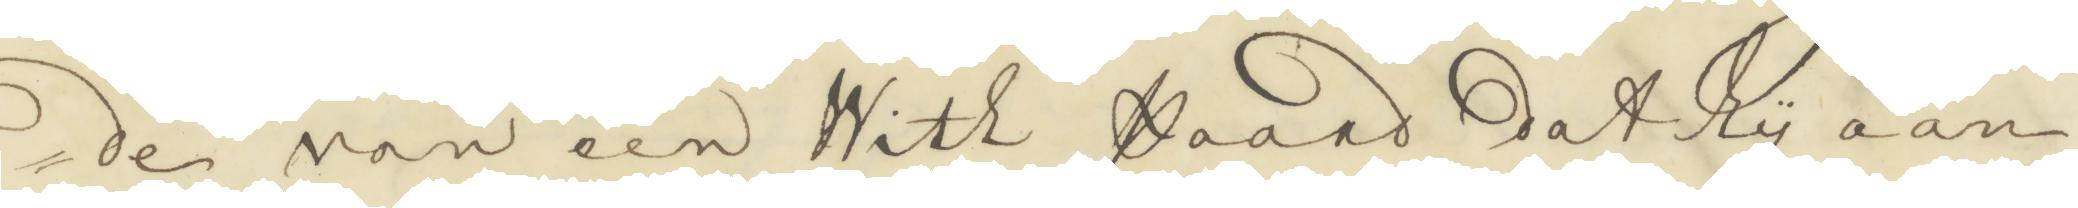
=den van een with paard dat hij aan
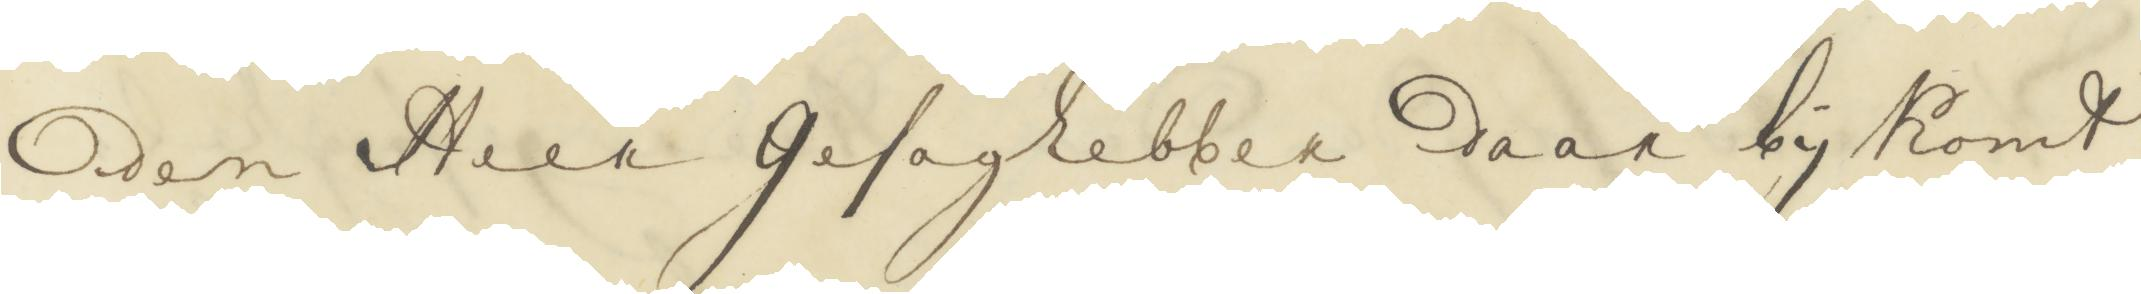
den Heer gesaghebber daar bij komt
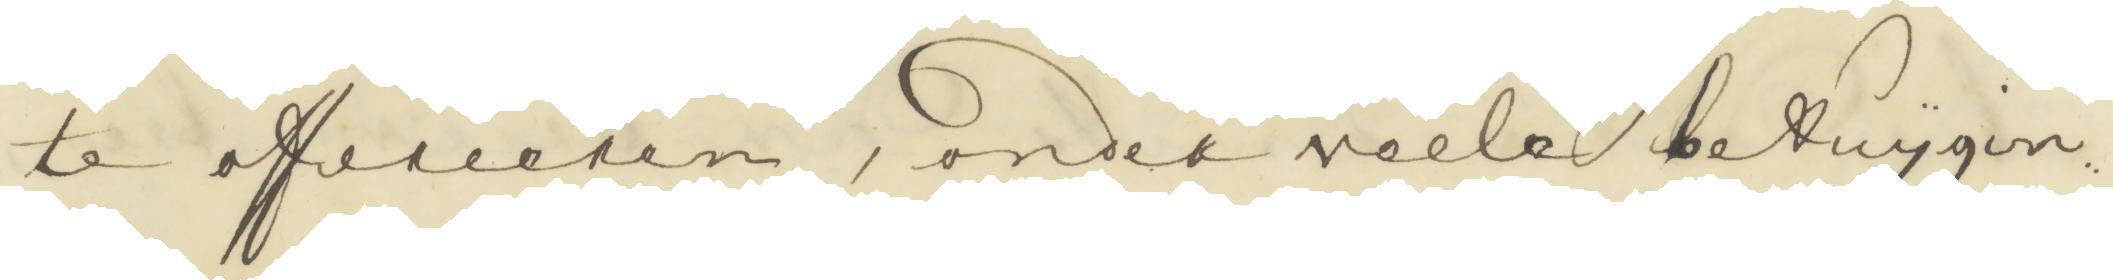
te offereeren, onder veele betuijgin„
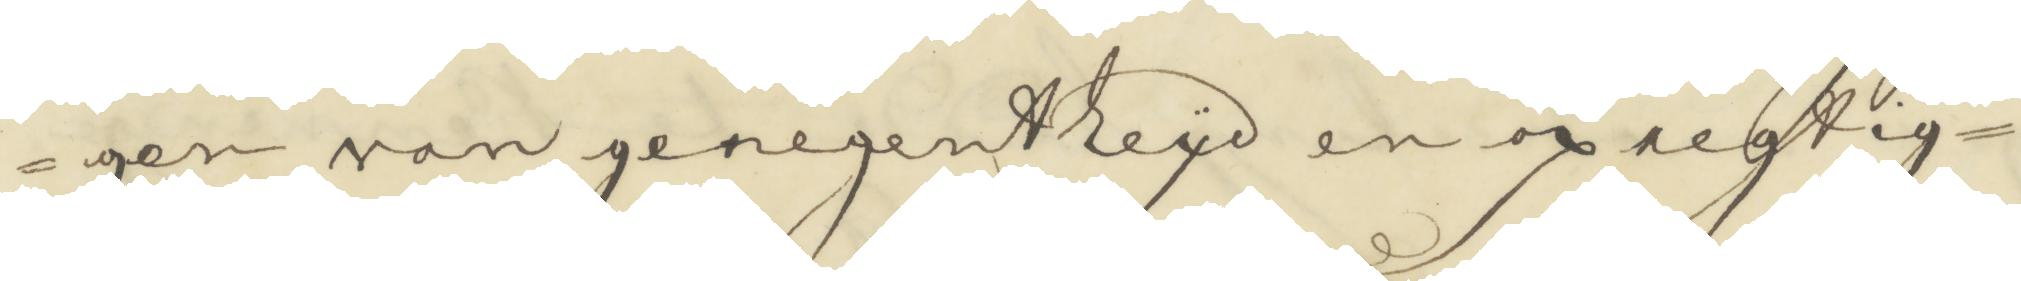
=gen van genegentheijd en op regtig=
